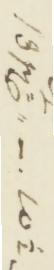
13 pC=t „-.10½
